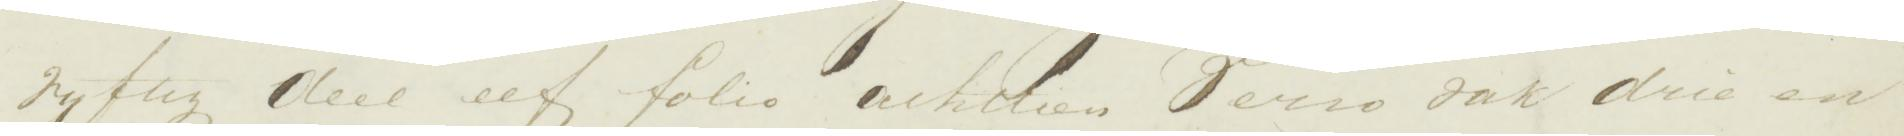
vyftig deel eef folio achttien Verso vak drie en
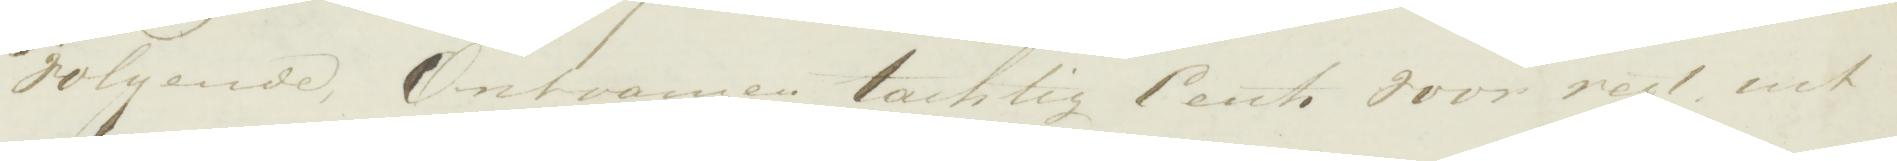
volgende, Ontvangen tachtig Cents voor regt, uit
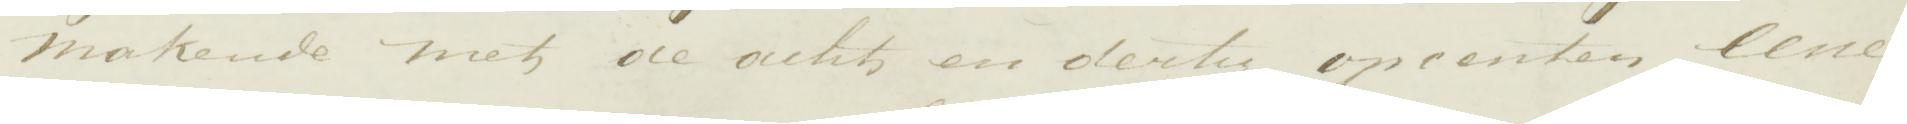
makende met de acht en dertig opcenten Eene
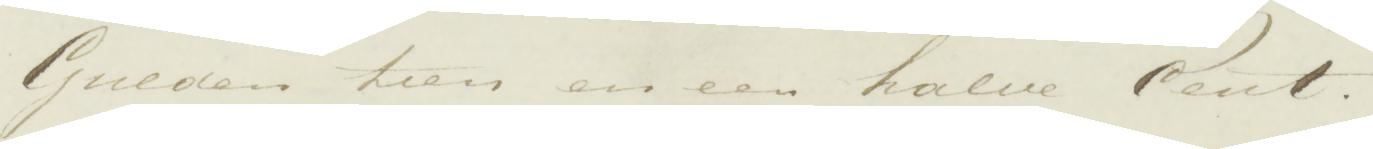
Gulden tien en een halve Cent.
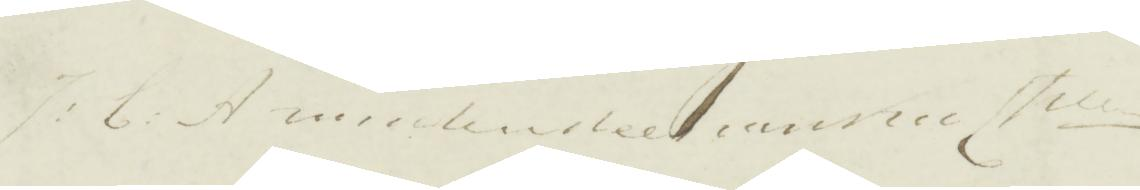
J: C: A vanderMeer van Kuffeler
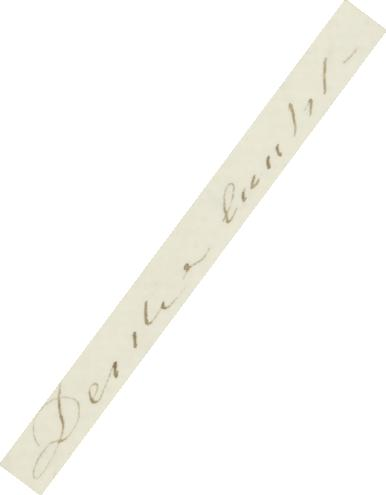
Derde en laatste
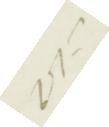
vr
